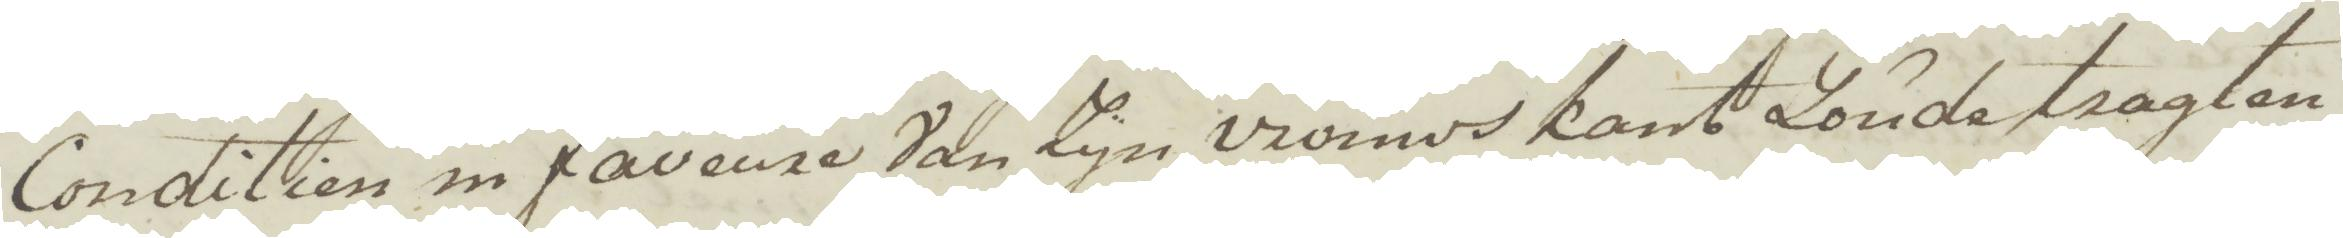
Conditien in faveure van zijn vrouws kant zoude tragten
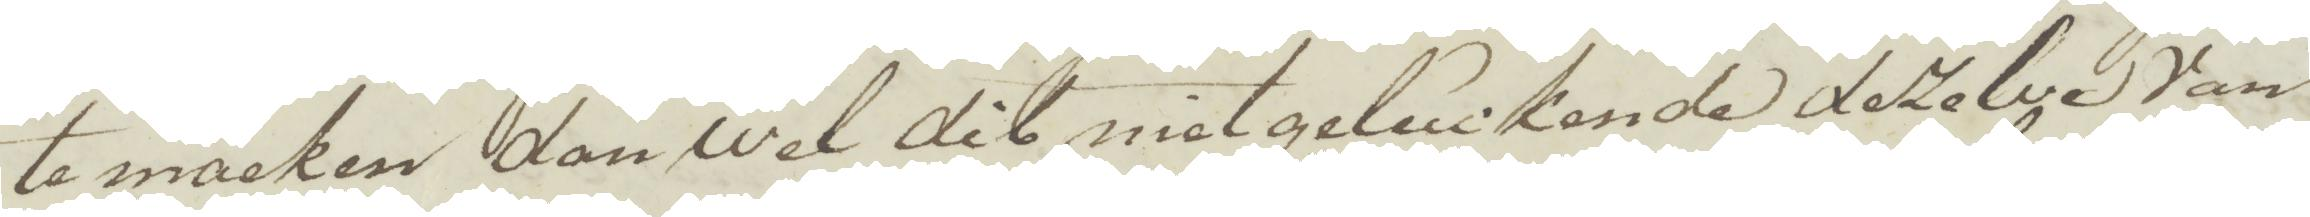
te maeken dan wel dit niet geluckende dezelve van
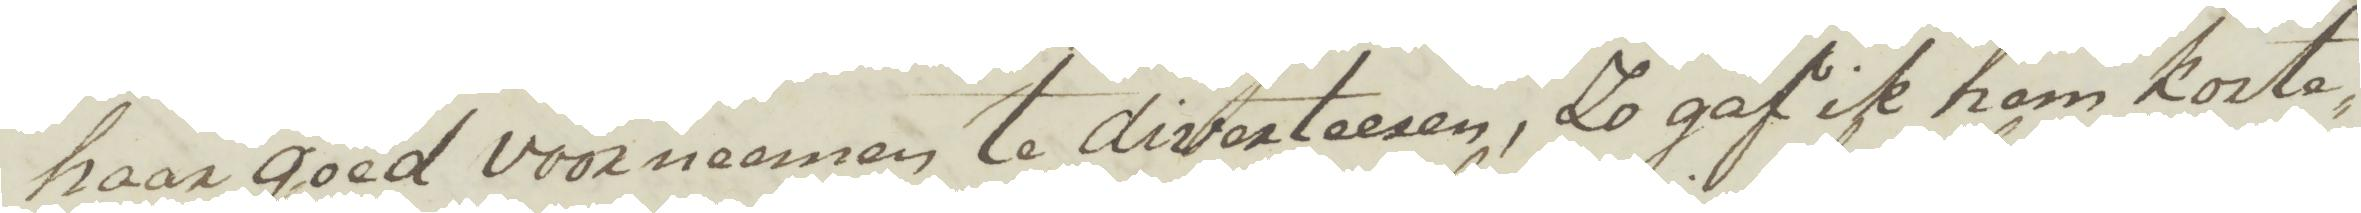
haar goed voorneemen te diverteeren, zo gaf ik hem korte„
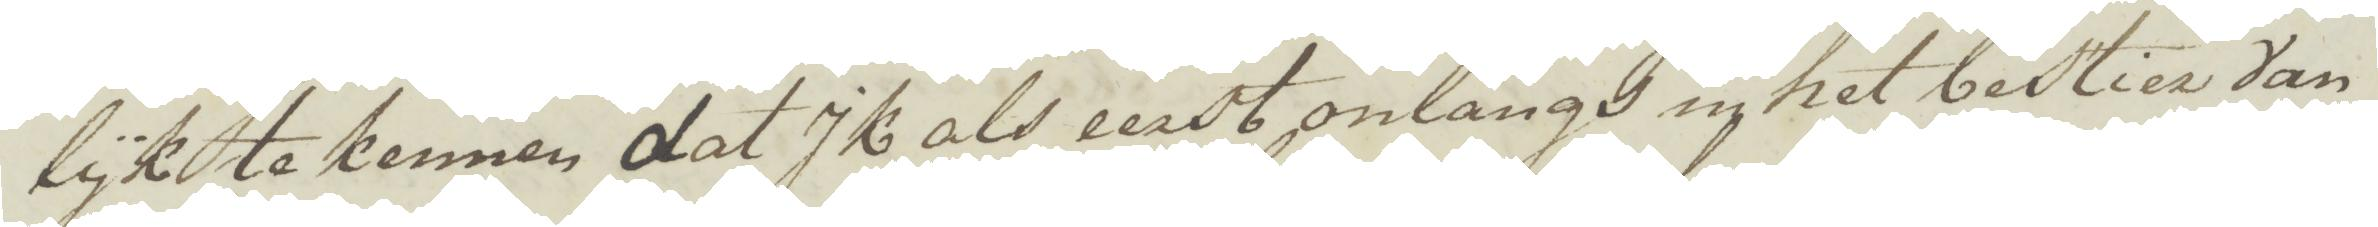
lijk te kennen dat jk als eerst onlangs in het bestier van
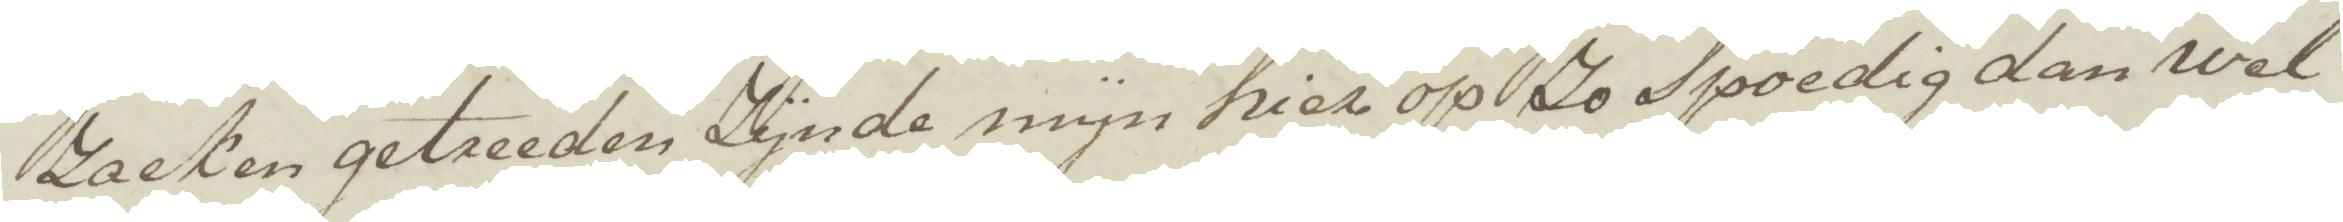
zaeken getreeden zijnde mijn hier op zo spoedig dan wel
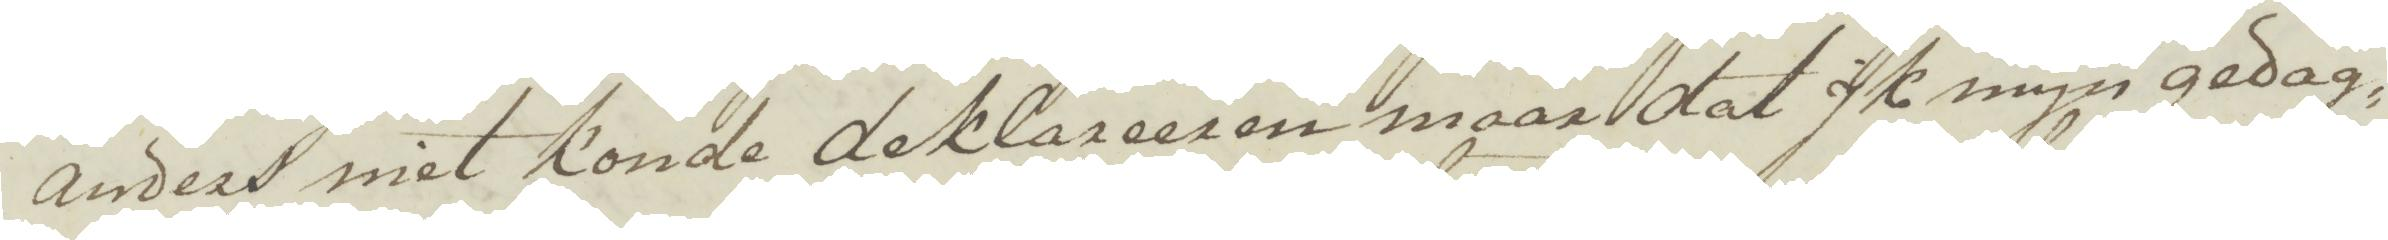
anders niet konde deklareeren maar dat ik mijn gedag„
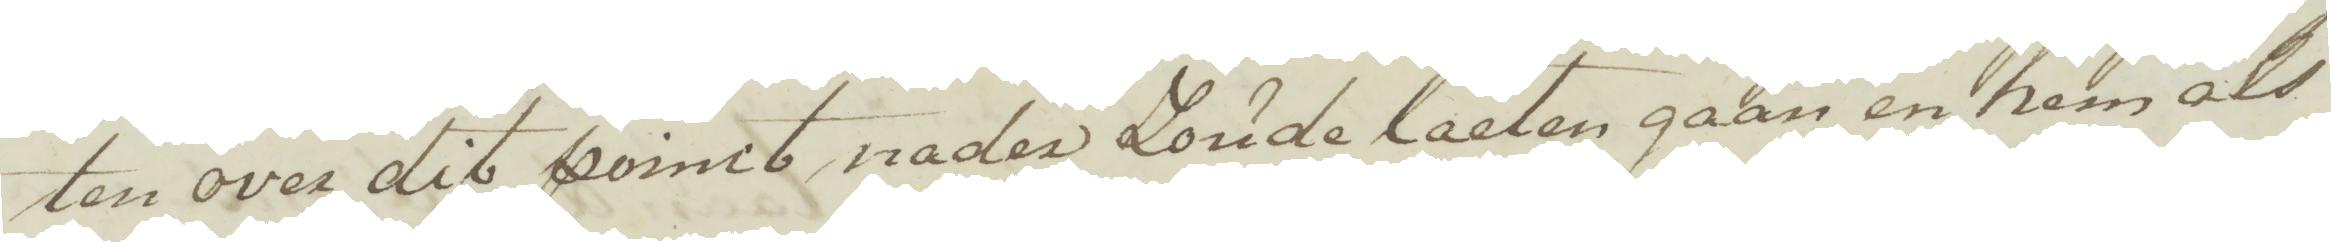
ten over dit poinct, nader zoude laeten gaan en hem als
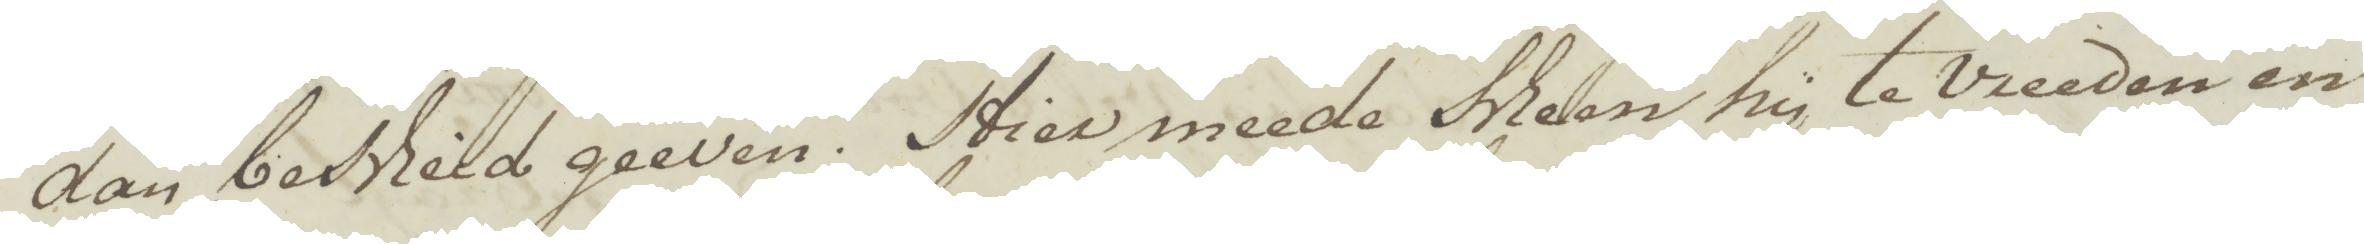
dan bescheid geeven. Hier meede scheen hij te vreeden en
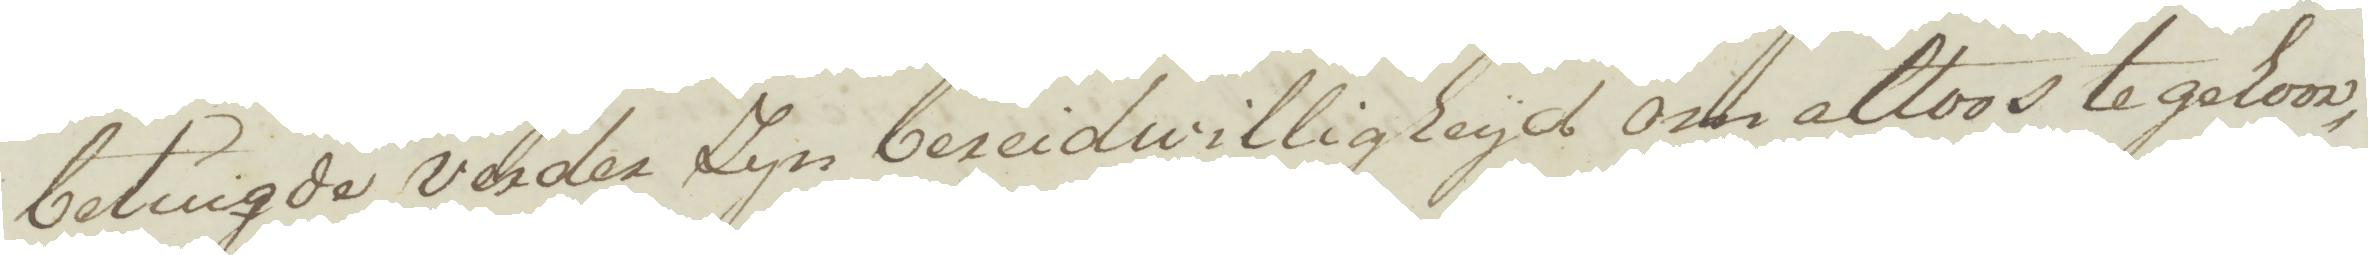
betuigde verder zyn bereidwilligheijd om altoos te gehoor„
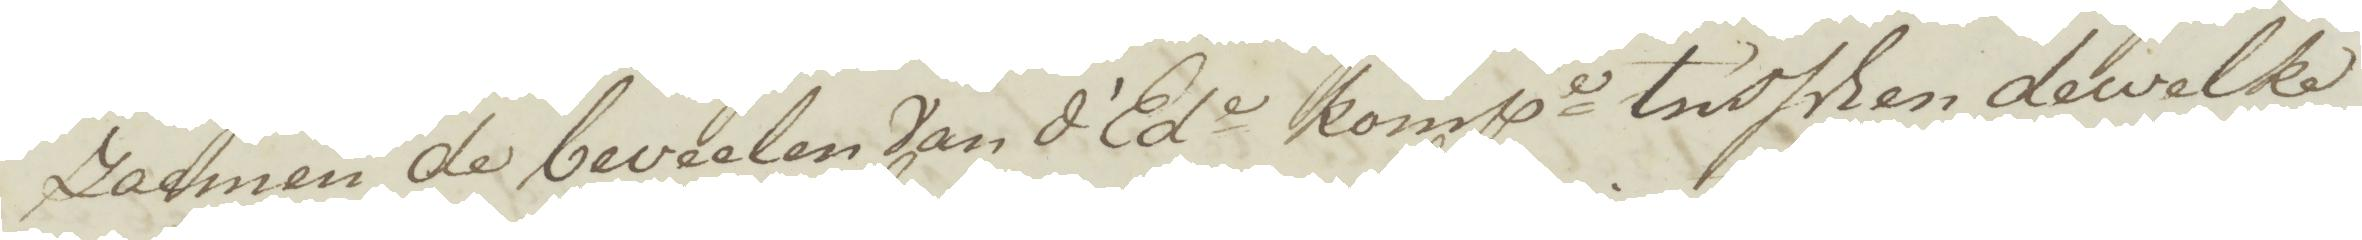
zaemen de beveelen van d’Ed=e komp=e tusschen dewelke
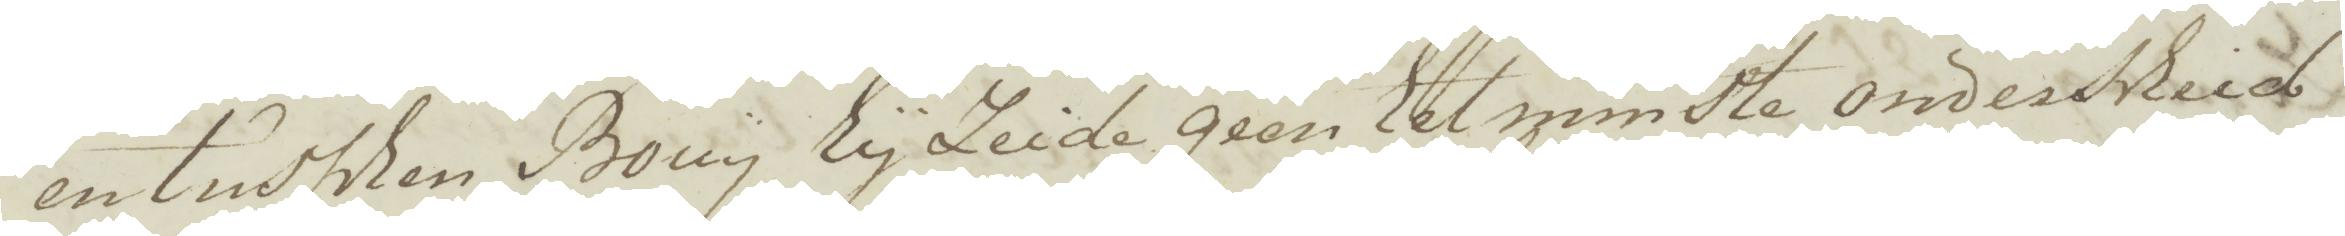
en tusschen Bouij hij zeide geen het minste onderscheid
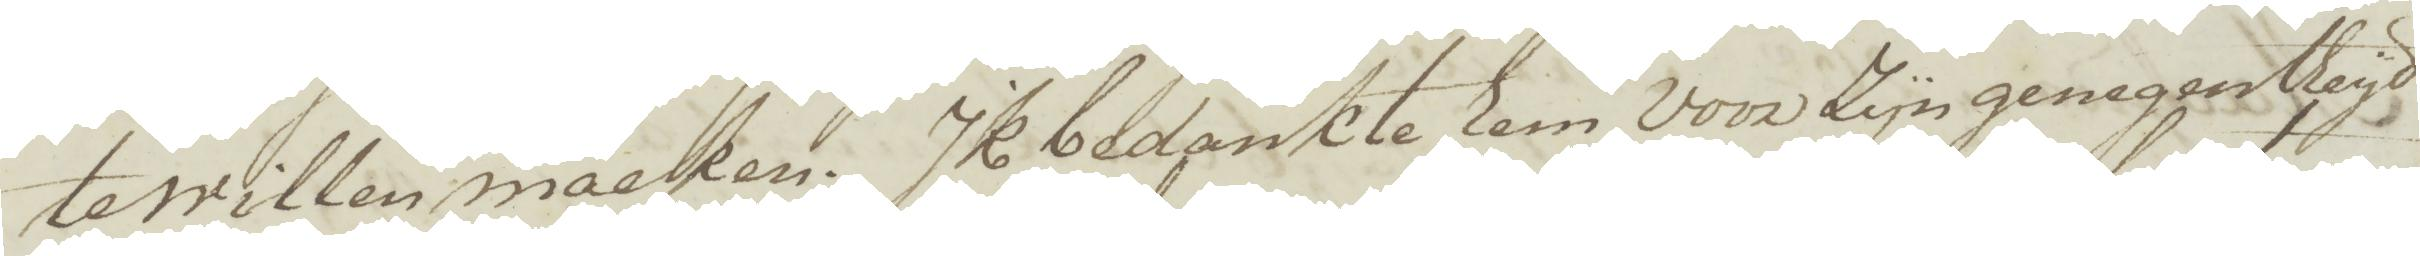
te willen maeken. Jk bedankte hem voor zijn genegentheijd
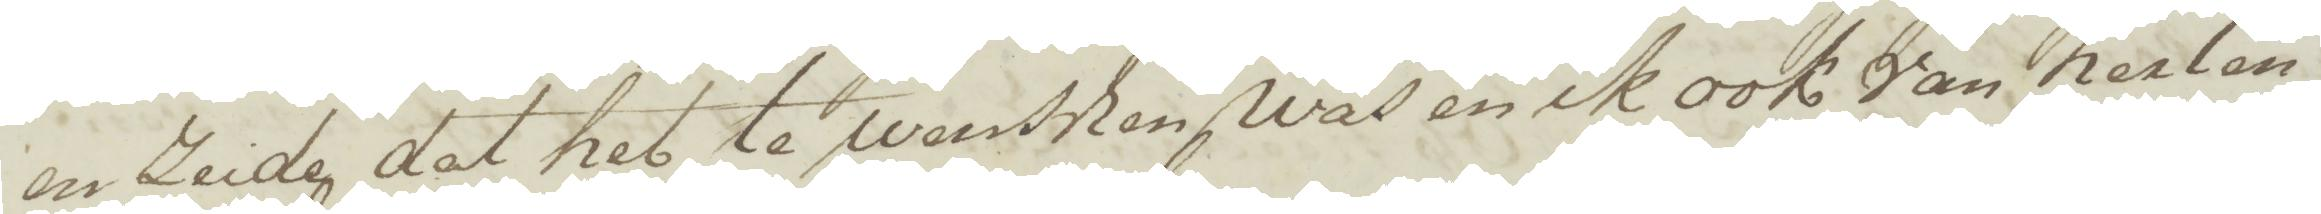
en zeide dat het te wenschen was en ik ook van herten
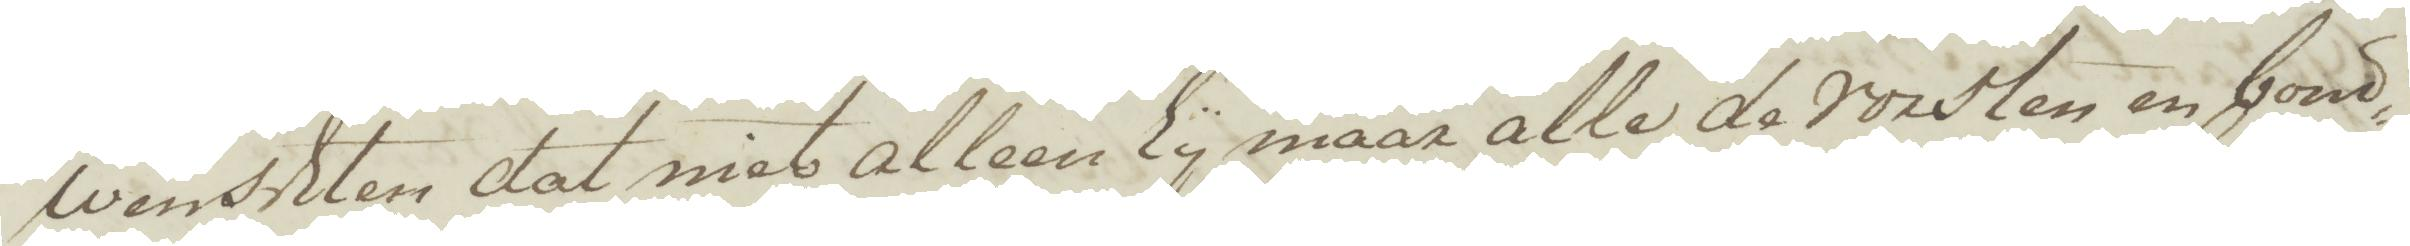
wenschten dat niet alleen hij maar alle de vorsten en bond„
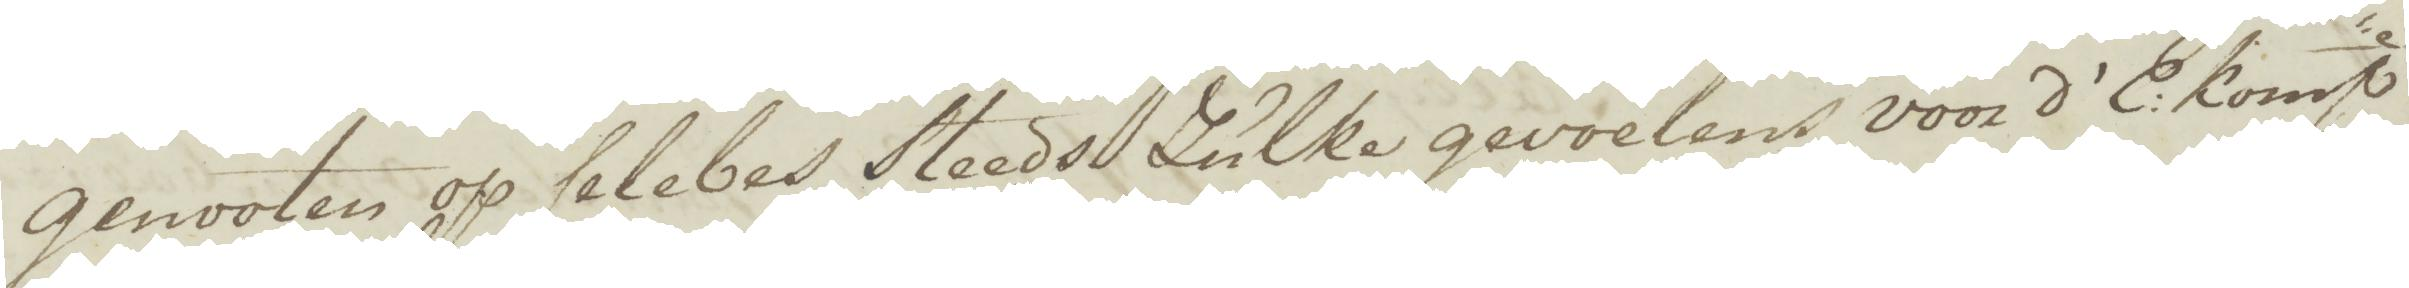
genooten op Celebes steeds zulke gevoelens voor d’E: kompe
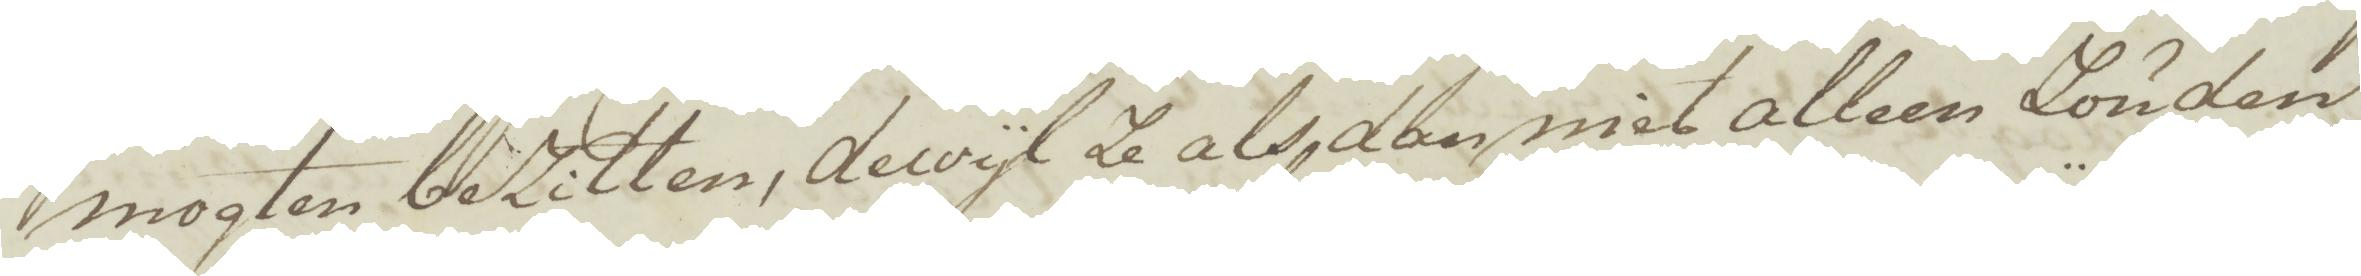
mogten bezitten, dewijl ze als, dan niet alleen zouden
